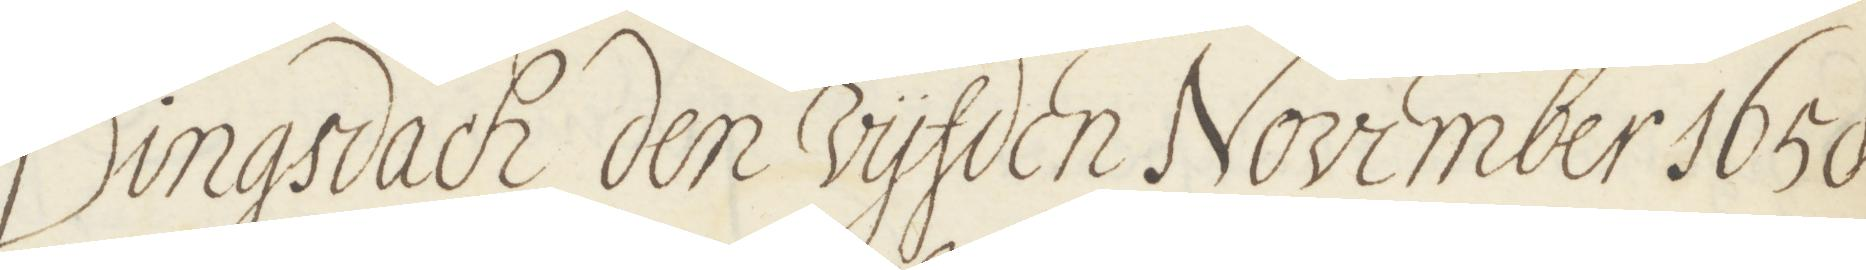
Dingsdach den vijfden November 1658
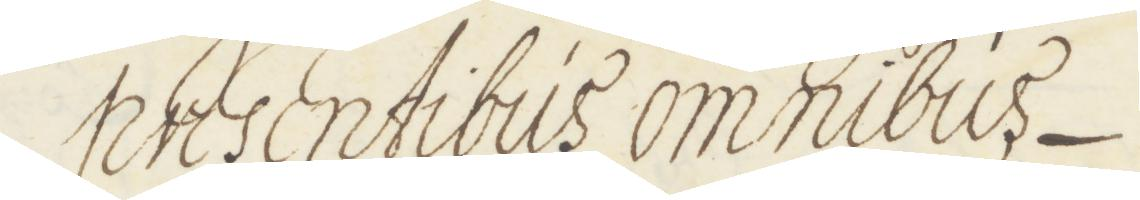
presentibus omnibus _
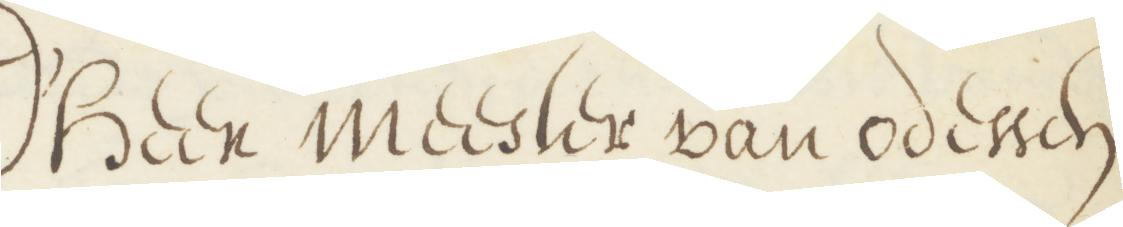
D'Heer meester van odessen
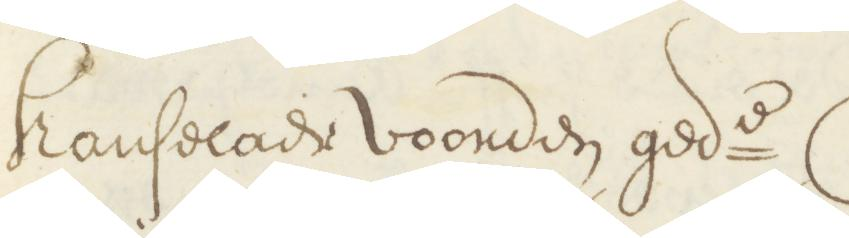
kanselaer voorden ged=e
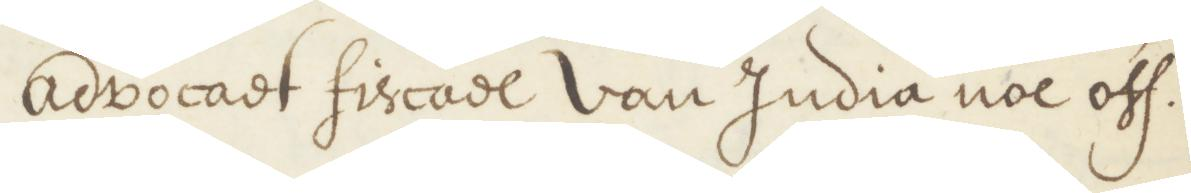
advocaet fiscael van Jndia noe off.
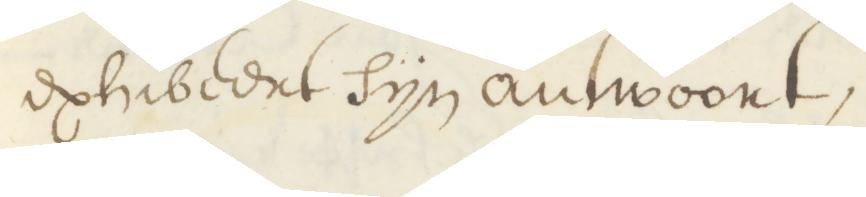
exhibeert sijn antwoort,
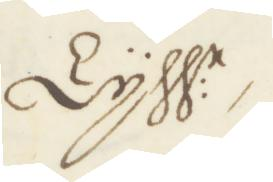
Eijss:r,
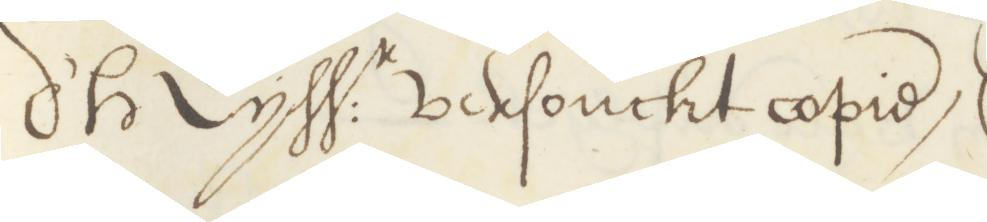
d’h Eijss:r versouckt copie,
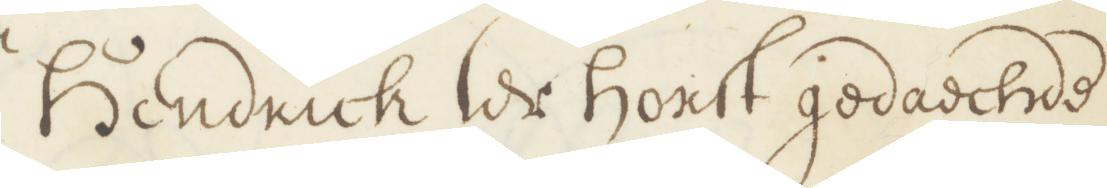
Hendrick ter horst gedaechde
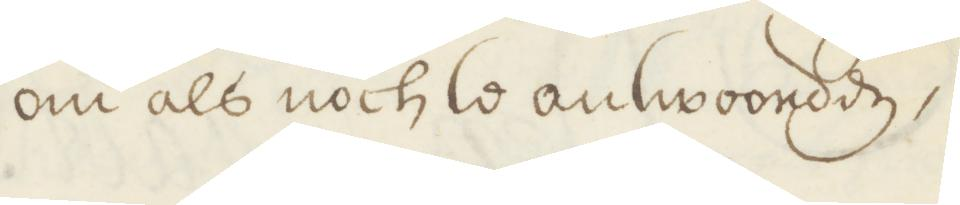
om als noch te antwoorden,
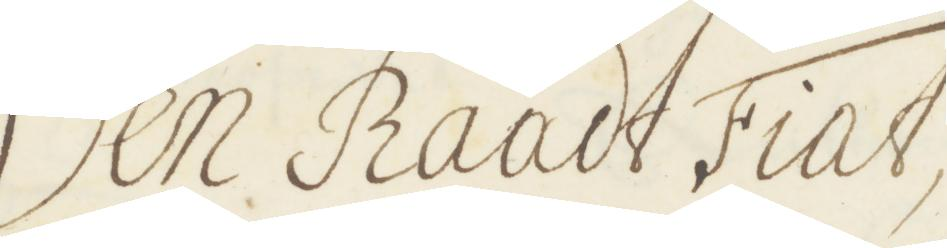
Den Raadt Fiat,
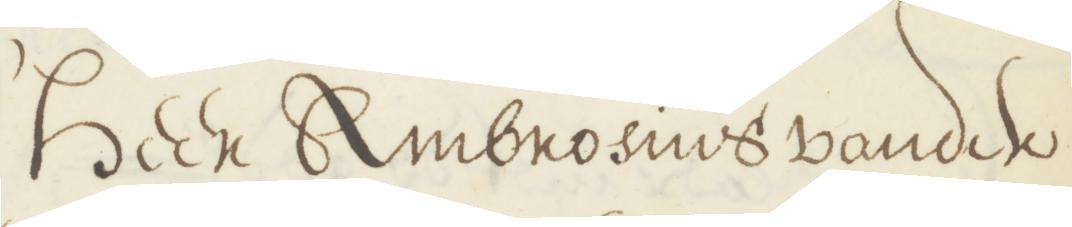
D'Heer Ambrosius vander
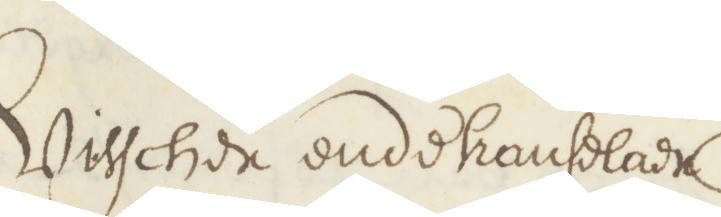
Wisscher en de kanselaer
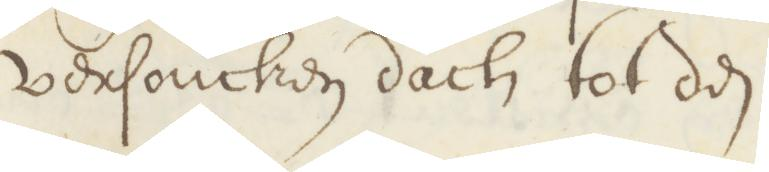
versoucken dach tot den
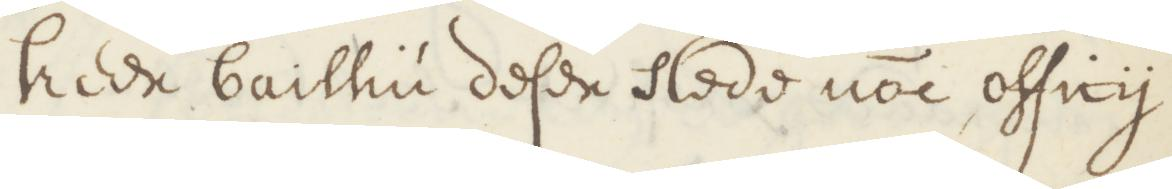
keer bailliu deser stede noe officij
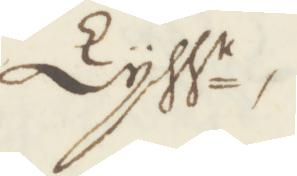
Eijss=r,
